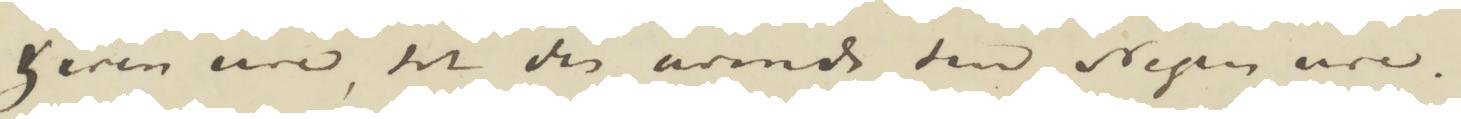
zeven ure, tot des avonds ten Negen ure.
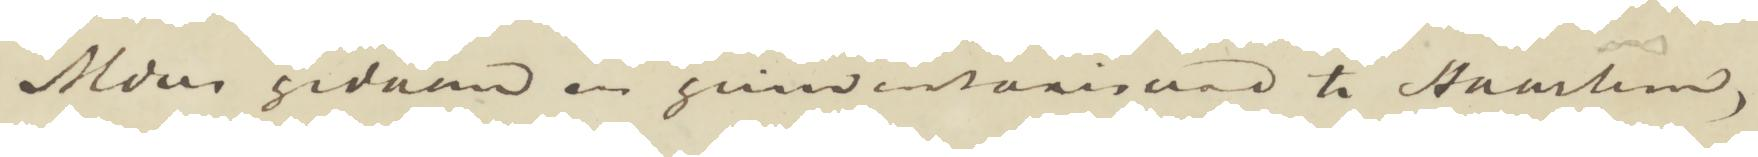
Aldus gedaan en geinventariseerd te Haarlem.
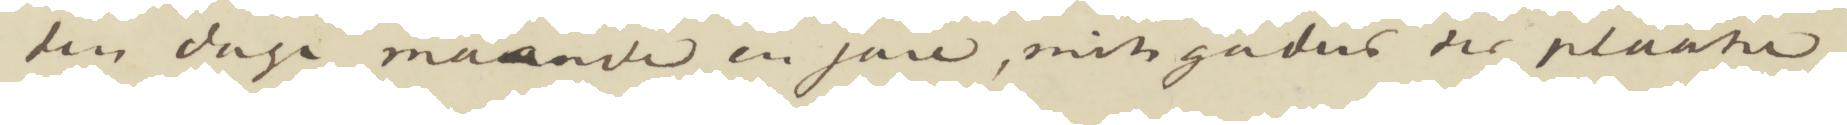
ten dage maande en jare, mitsgaders ter plaatse
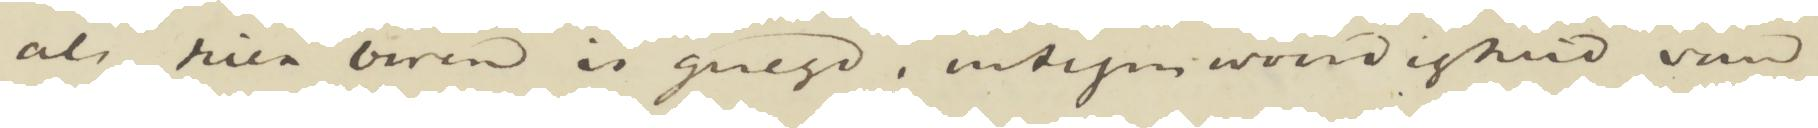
als hier boven is gezegd, integenwoordigheid van
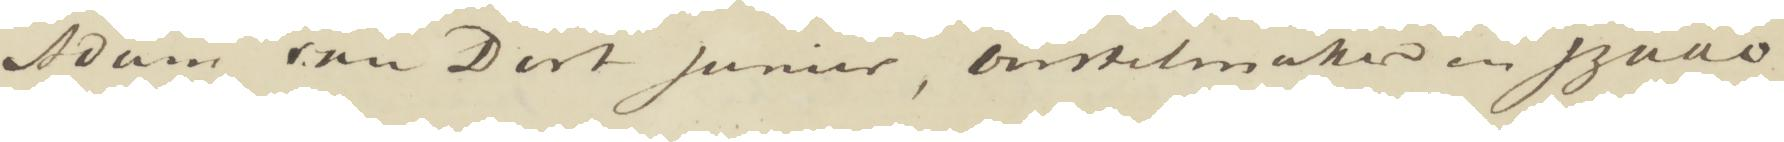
Adam van Dort Junior, borstelmaker en Izaac
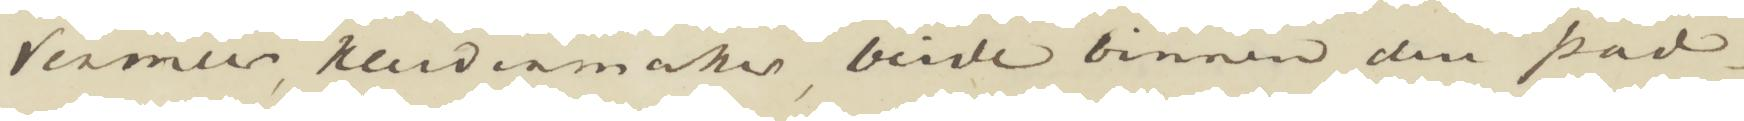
Vermeer, kleedermaker, beide binnen deze stad
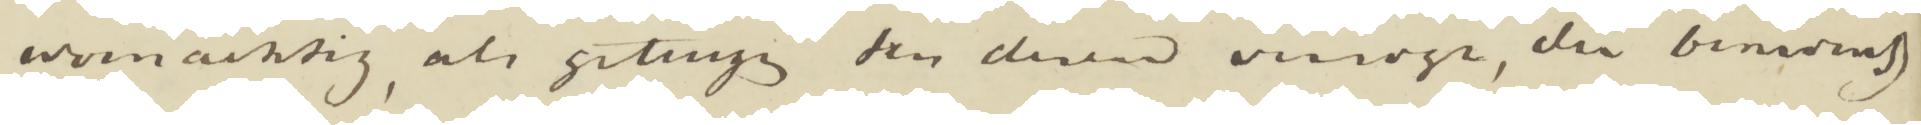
woonachtig, als getuigen ten dezen verzogt, die benevens
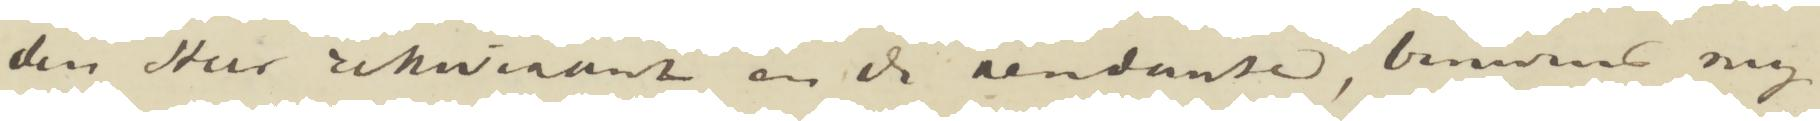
den Heer rekwirant en de rendante, benevens my
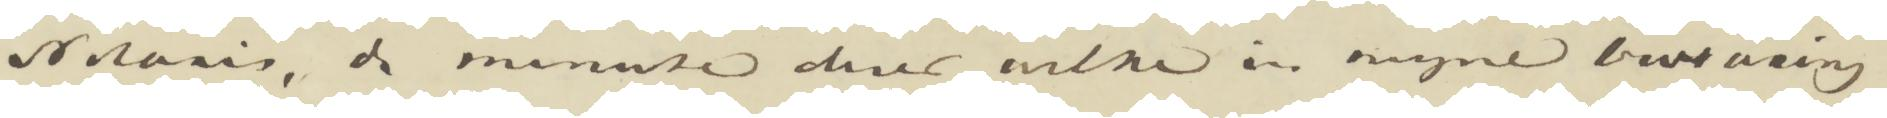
Notaris, de minute dezer, welke in myne bewaring
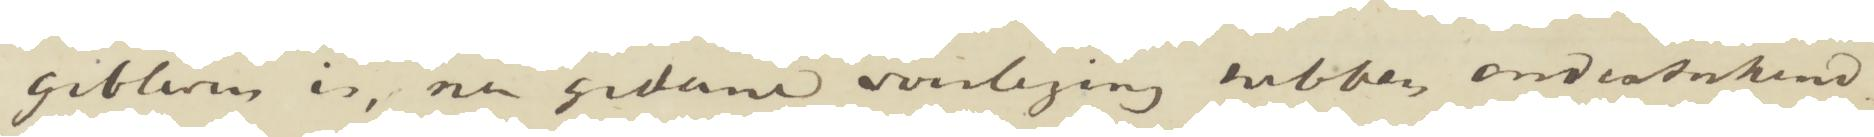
gebleven is, na gedane voorlezing hebben onderteekend
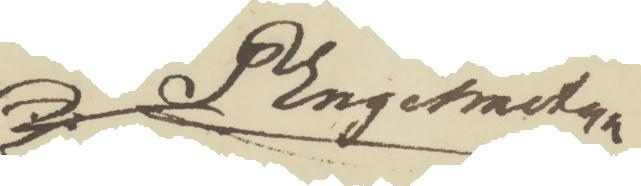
P Engesmet
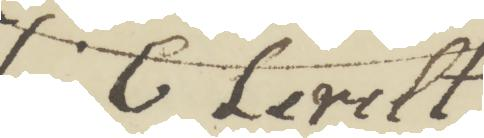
J: C Levelt
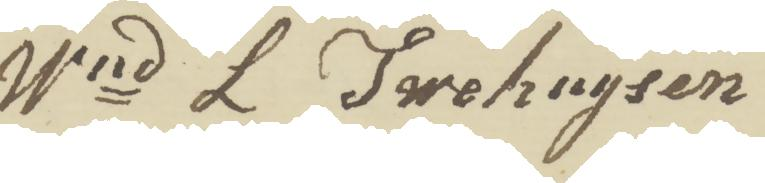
W=nd L Twehuysen
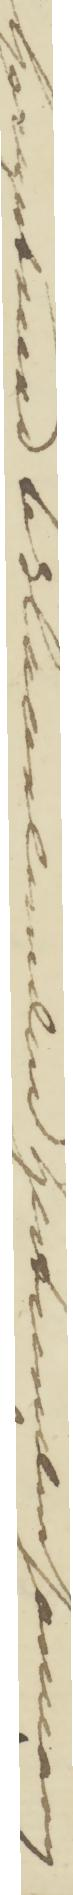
Geregistreerd teHaarlemden ZestiendenJanuary
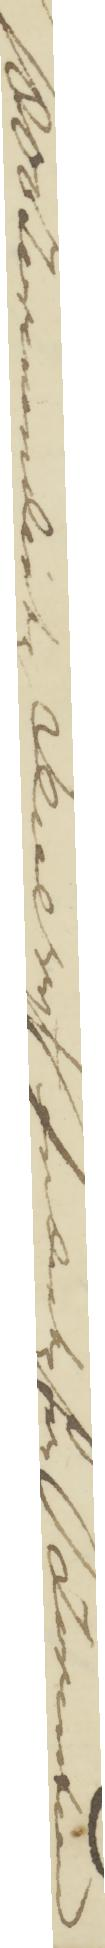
1800 Zevenendertig Deelvyf en dertig fol Zeventien
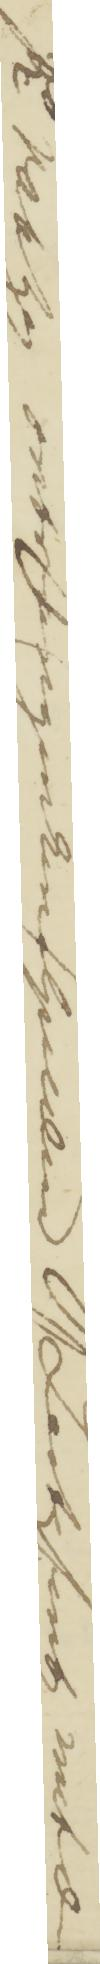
R=o vakzes ontvangen EeneGulden ZestigCents met de
